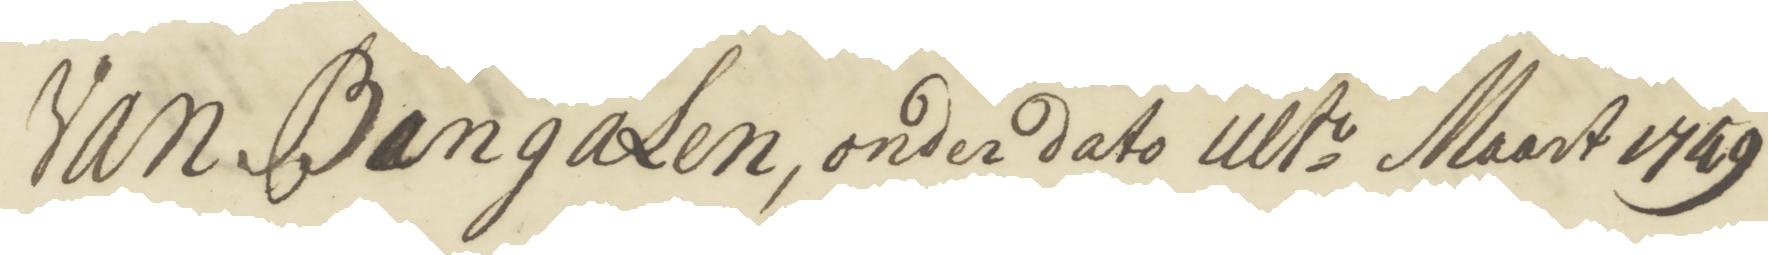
Van Bangalen, onder dato ult=o Maart 1749
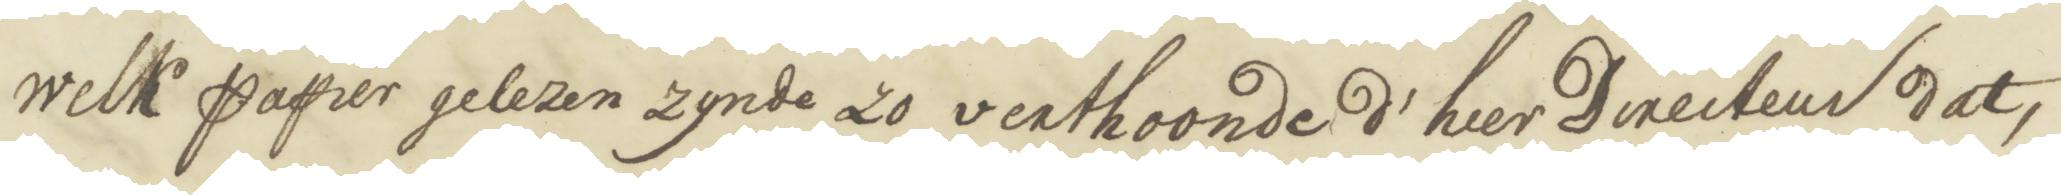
welk papier gelezen zynde zo verthoonde d’ hier Directeur dat,
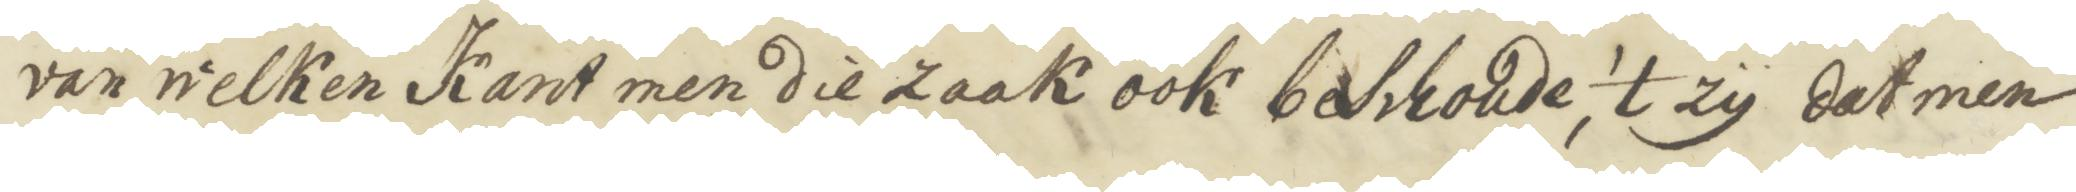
van welken kant men die zaak ook beschoude, ’t zij dat men
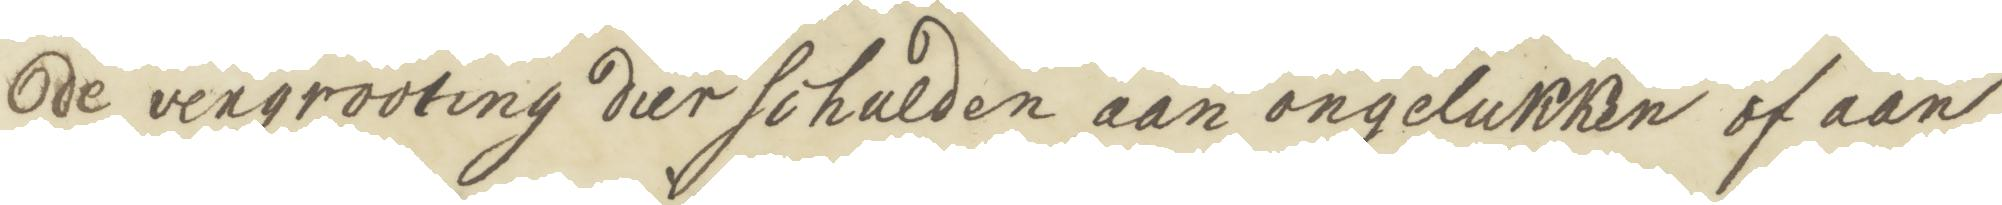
de vergrooting dier schulden aan ongelukken of aan
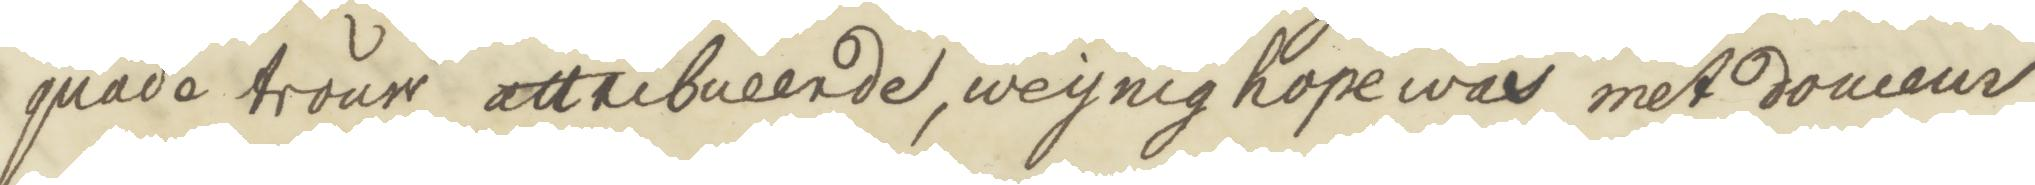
quade trouw attribueerde, weijnig hope was met douceur
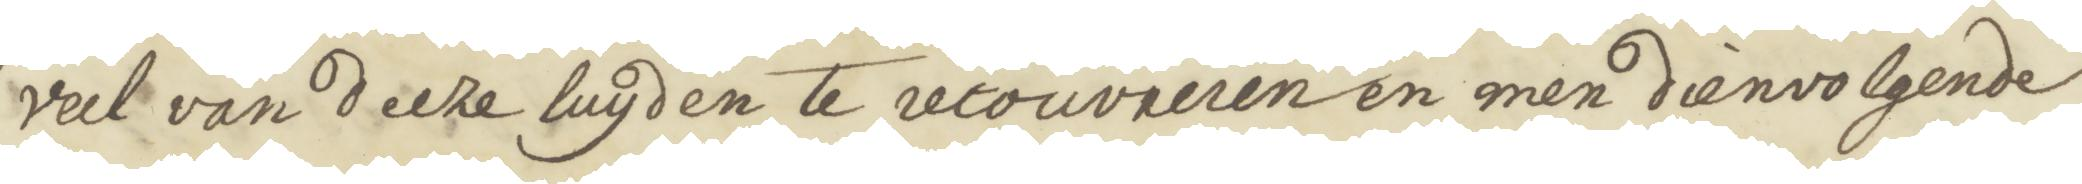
veel van deeze luyden te recouvreren en men dienvolgende
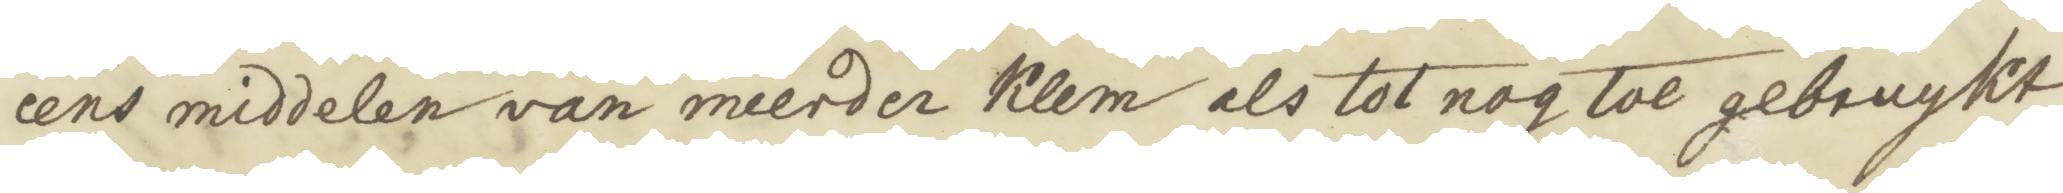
eens middelen van meerder klem als tot nog toe gebruykt
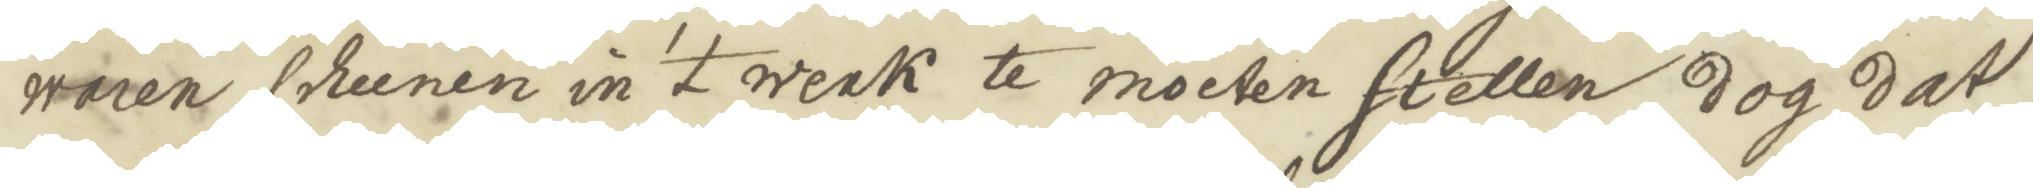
waren scheenen in 't werk te moeten stellen, dog dat
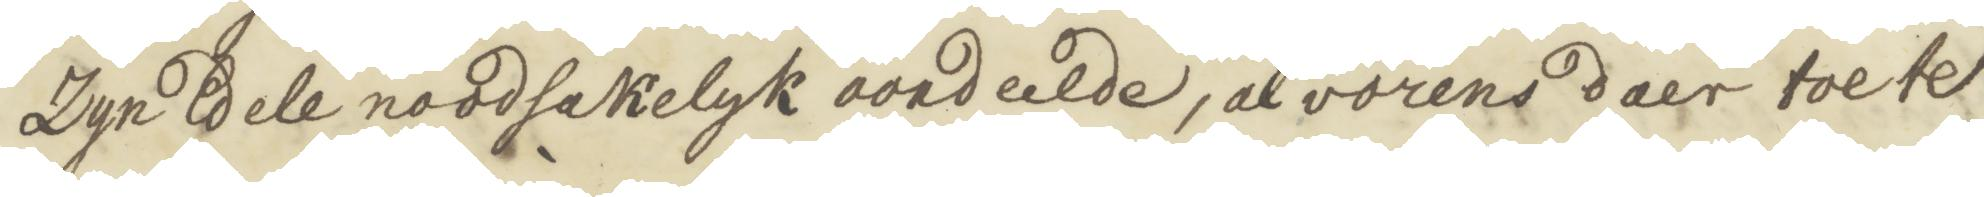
zyn Edele noodsakelijk oordeelde, al vorens daer toe te
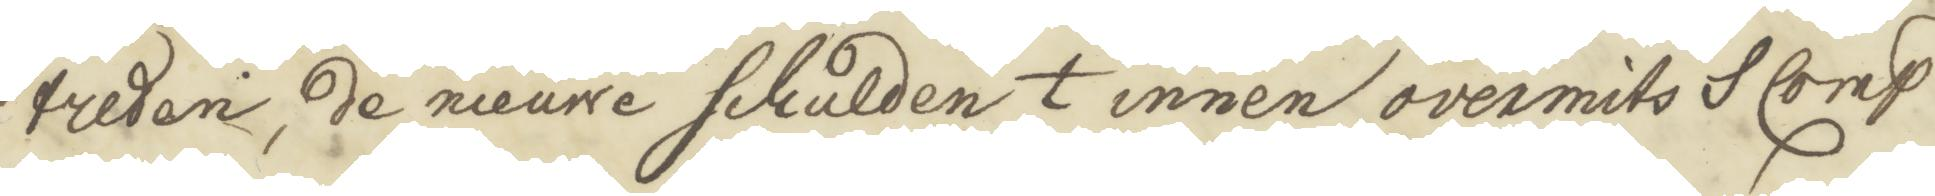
treden, de nieuwe schulden t innen overmits s Comps
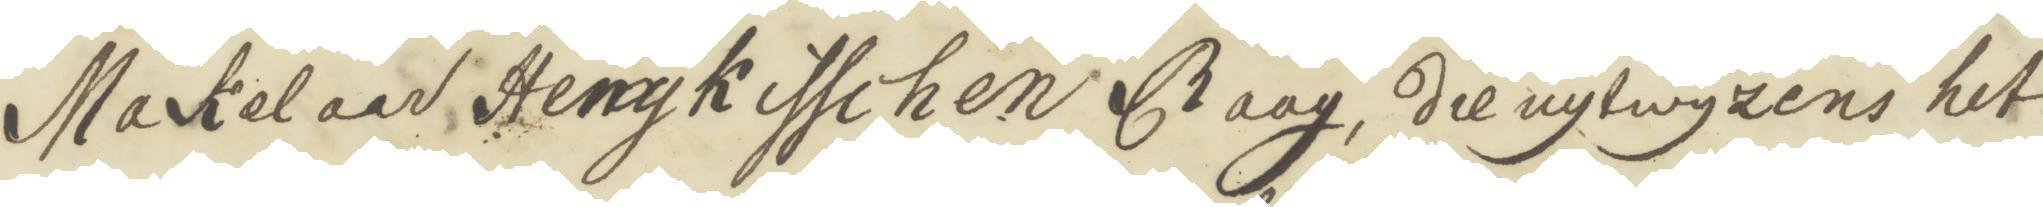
Makelaar Hewykisschen Raay, die uytwyzens het
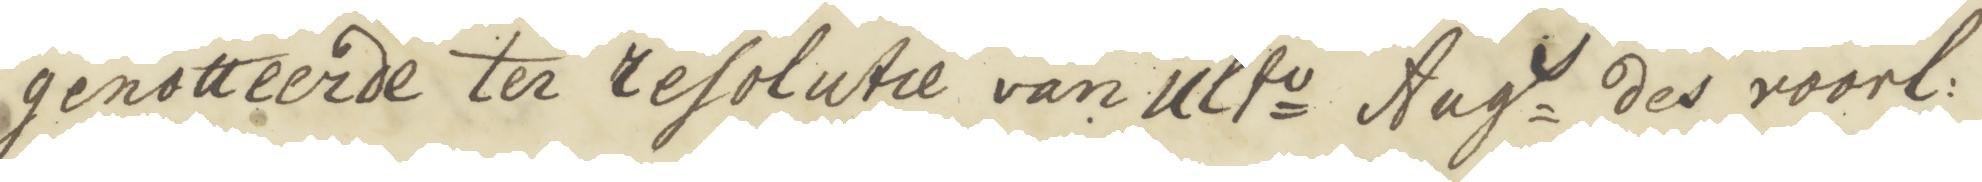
genotteerde ter resolutie van ult=o Aug=s des voorl:
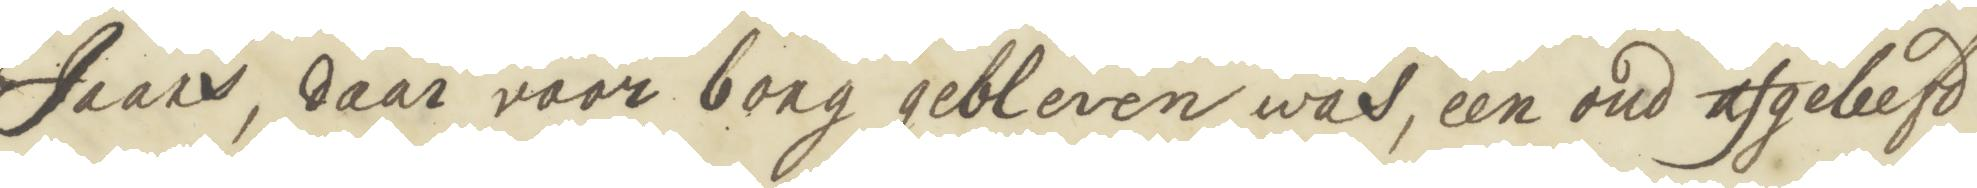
Jaars, daar voor borg gebleven was, een oud afgeleefd
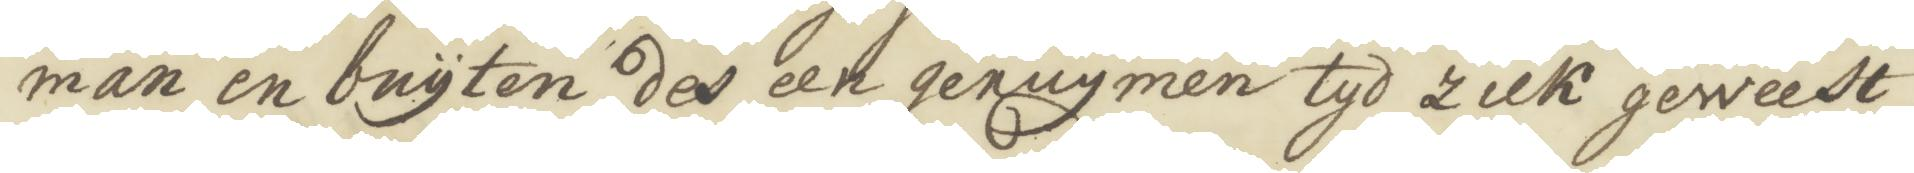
man en buijten des een geruymen tyd ziek geweest
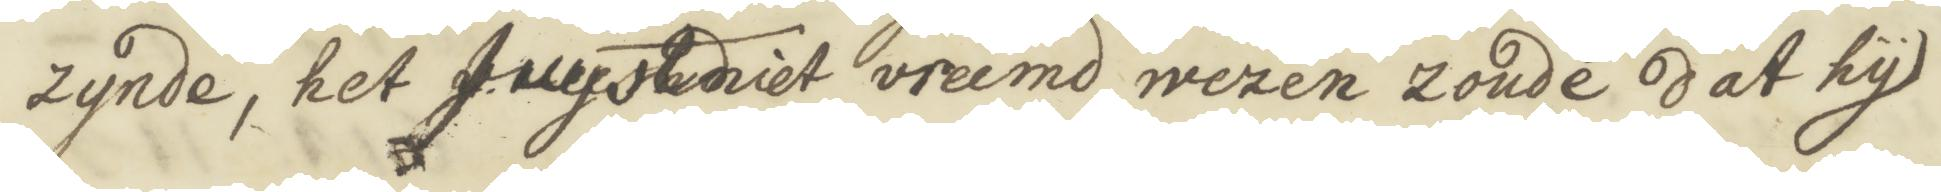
zynde, het Juystniet vreemd wezen zoude dat hij
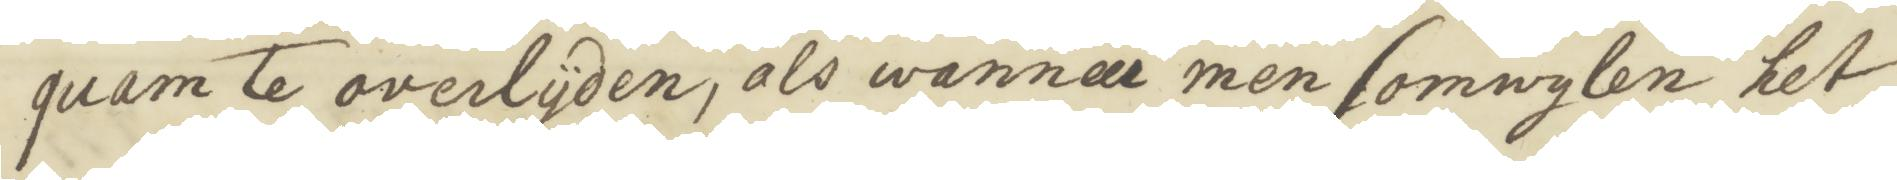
quam te overlijden, als wanneer men somwylen het
